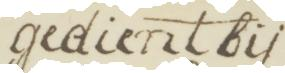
gedient bij
